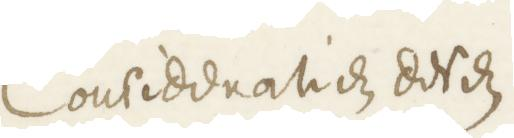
Consideratien desen
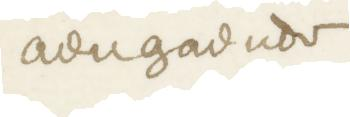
aengaende
